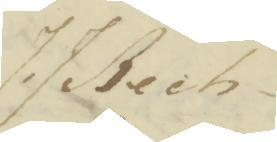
J. J Bech
